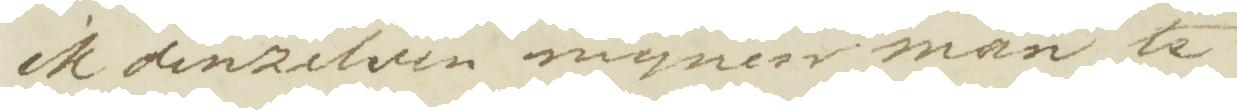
ik denzelven mynen man te
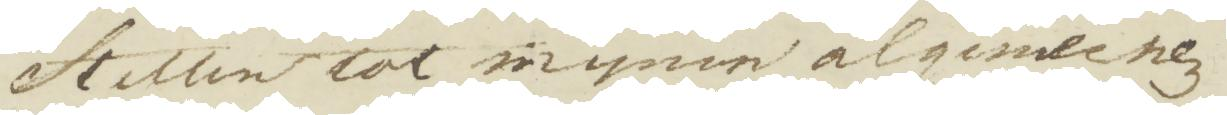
stellen tot mynen algemeenen
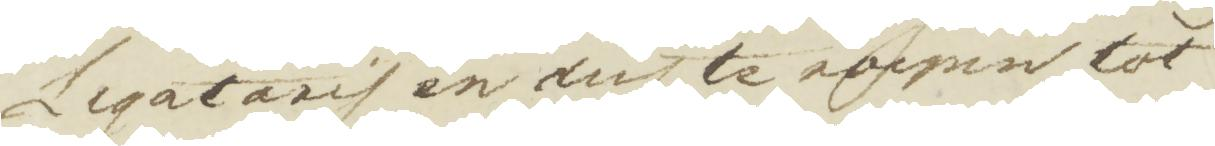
Legataris en dus te roepen tot
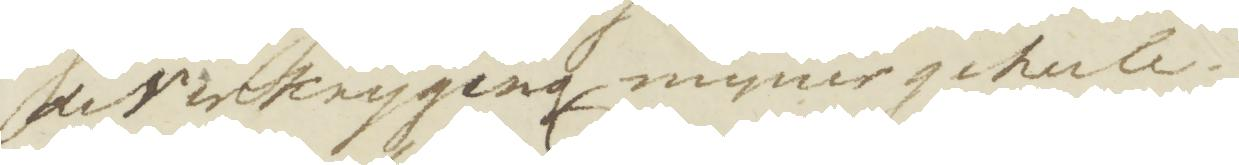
de Verkryging myner geheele.
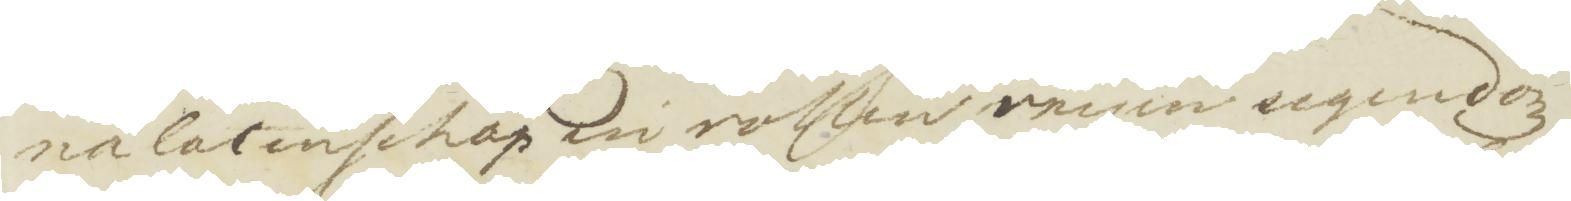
nalatenschap in vollen vryen eigendom,
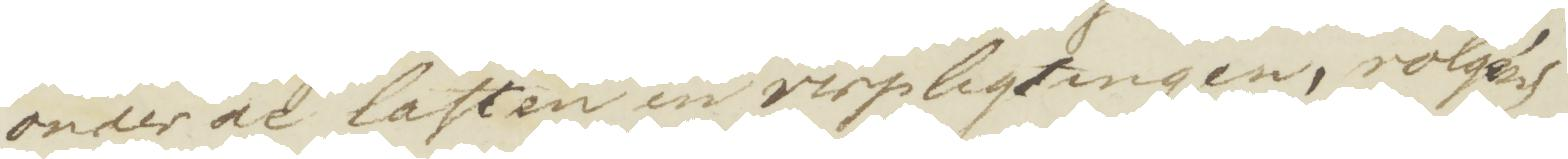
onder de lasten en verpligtingen, volgens
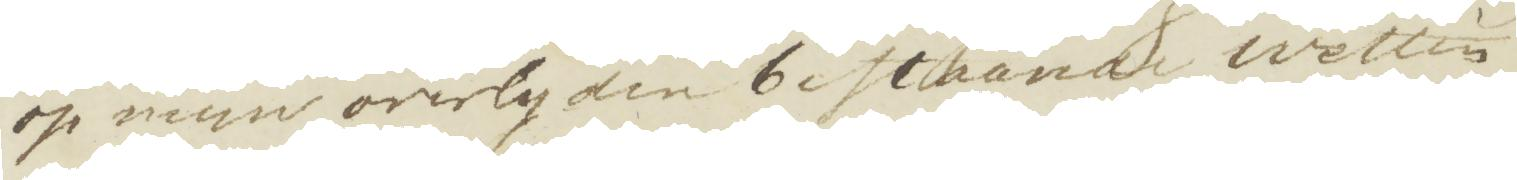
op mijn overlyden bestaande wetten
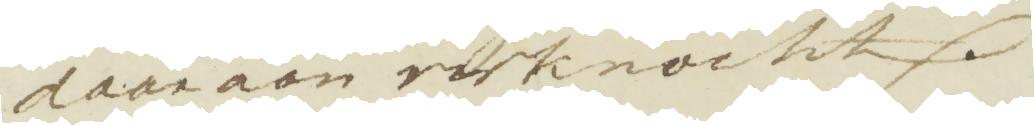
daar aan verknocht.
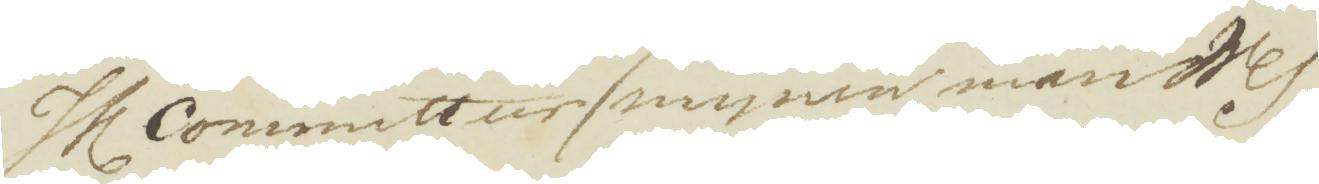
Ik Committeer mynen man Wes
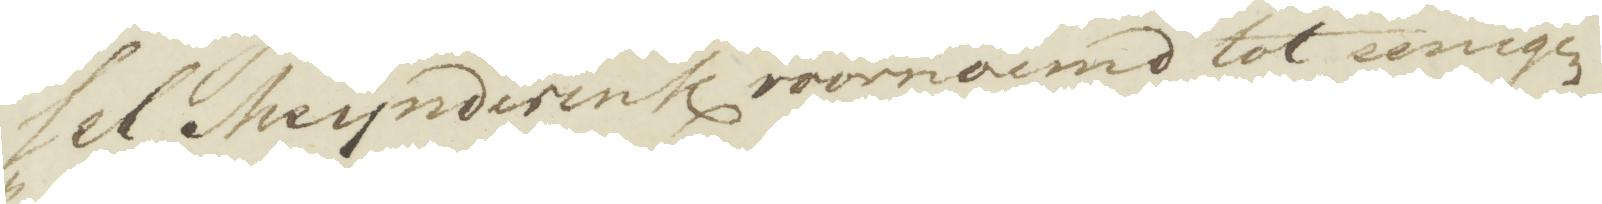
sel Meynderink voornoemd tot eenigen
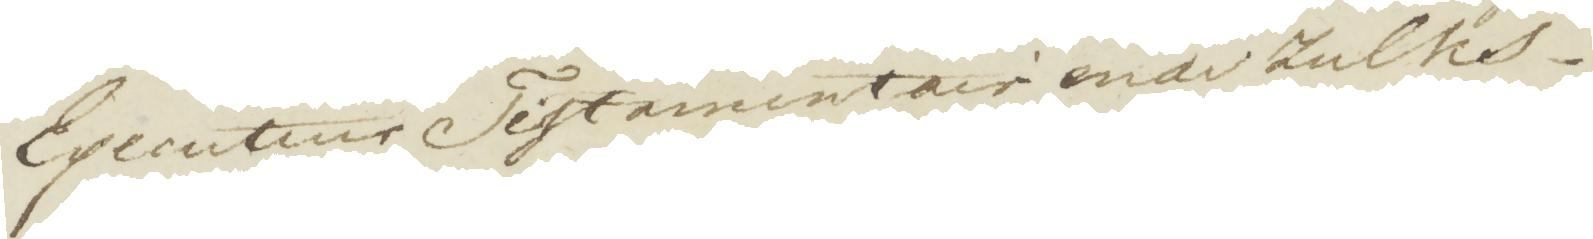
Executeur Testamentair ende zulks-
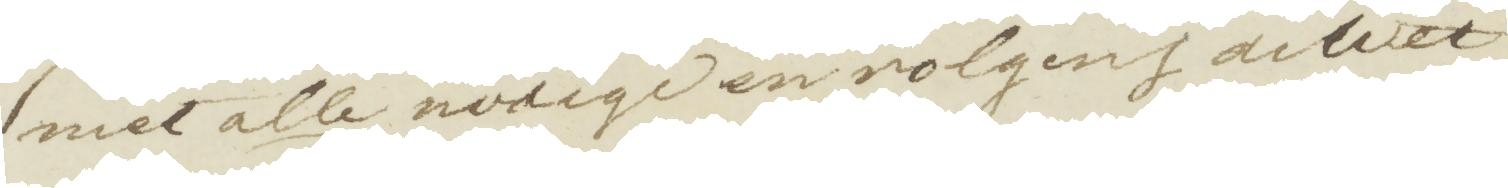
met alle nodige en volgens de Wet
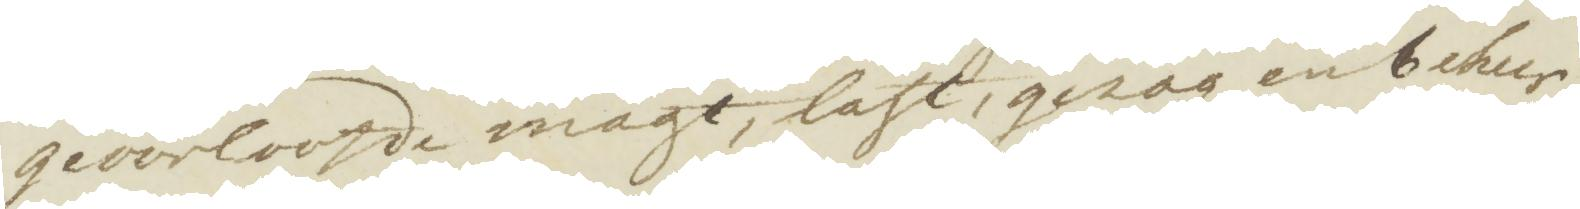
geoorloofde magt, last, gezag en beheer
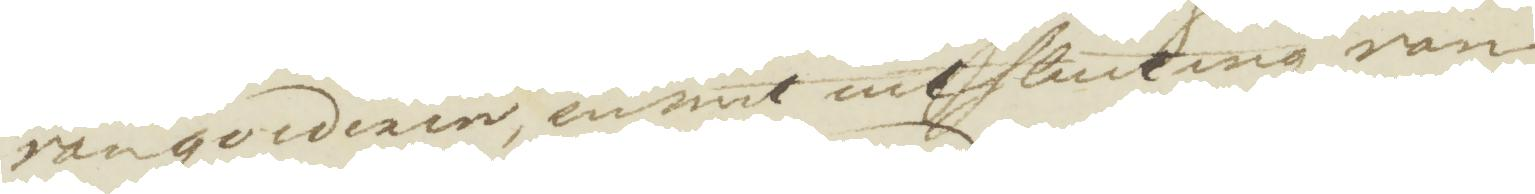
van goederen, en met uitsluiting van
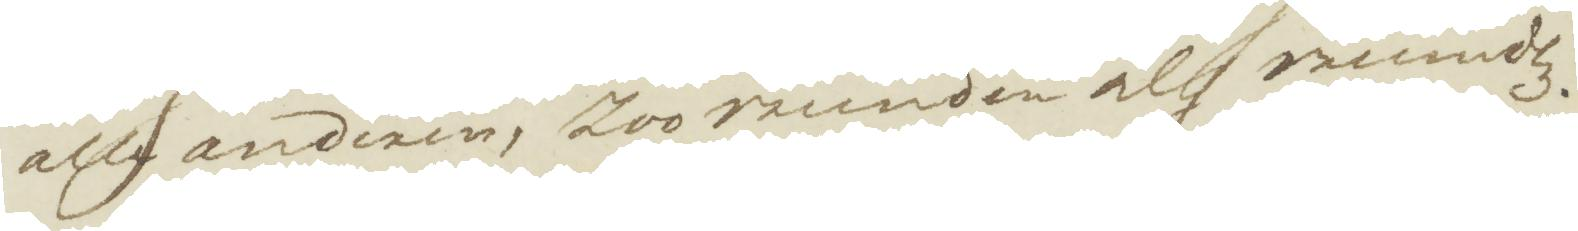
alle anderen, zoo vrunden als vreemden
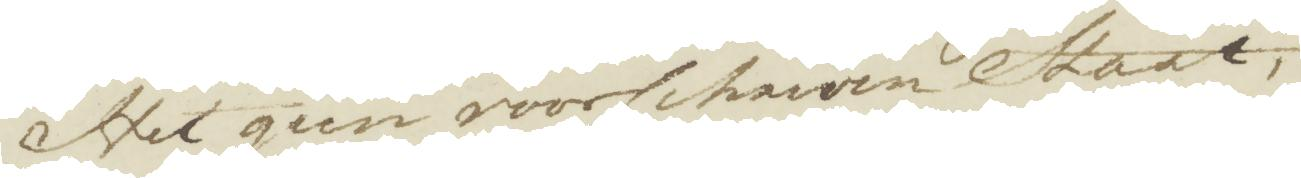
Het geen voorschreven Staat,
